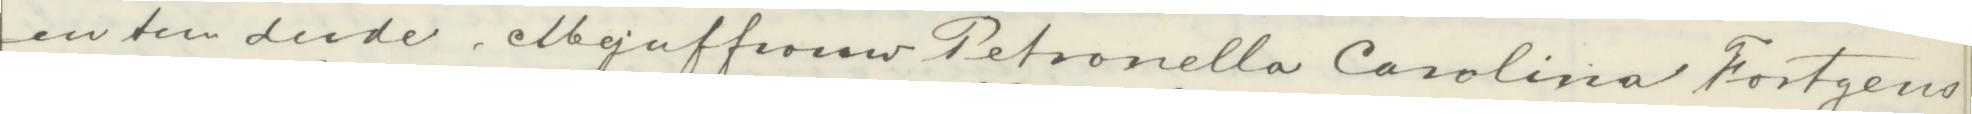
en ten derde, Mejuffrouw Petronella Carolina Fortgens
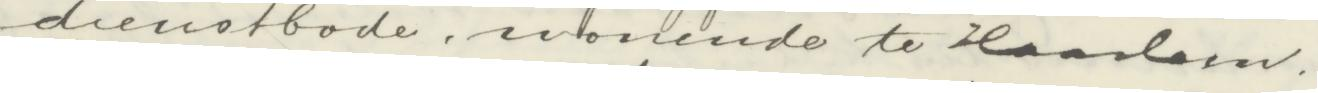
dienstbode, wonende te Haarlem.
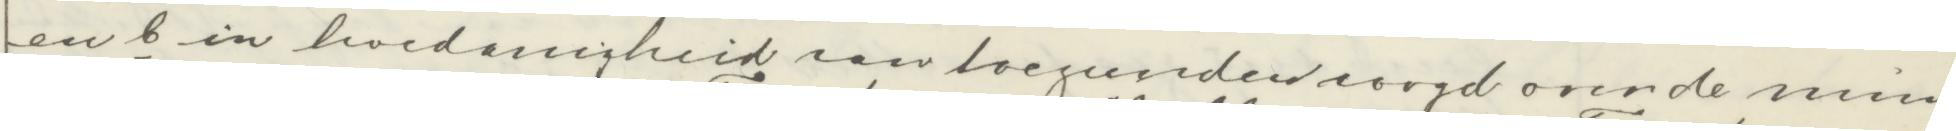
en b in hoedanigheid van toezienden voogd over de min
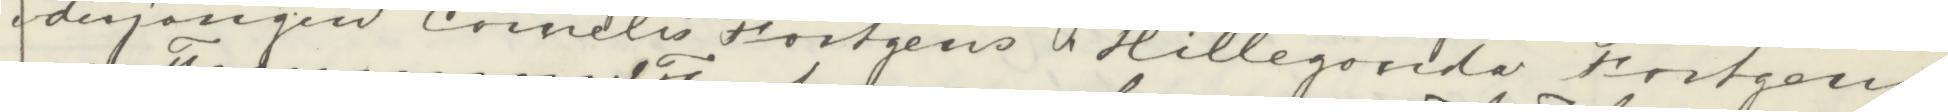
derjarigen Cornelis Fortgens, Hillegonda Fortgens
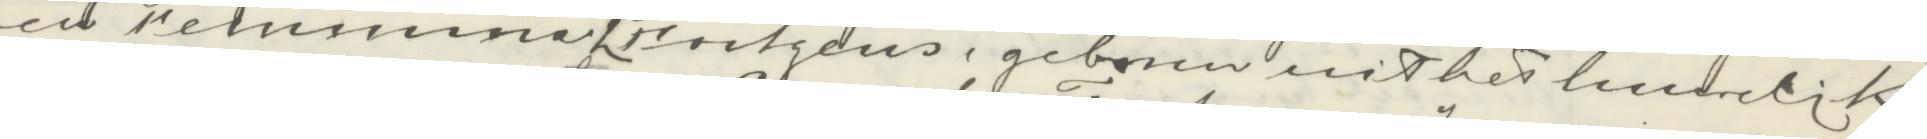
en Femmina ¶ Fortgens, geboren uit het huwelijk
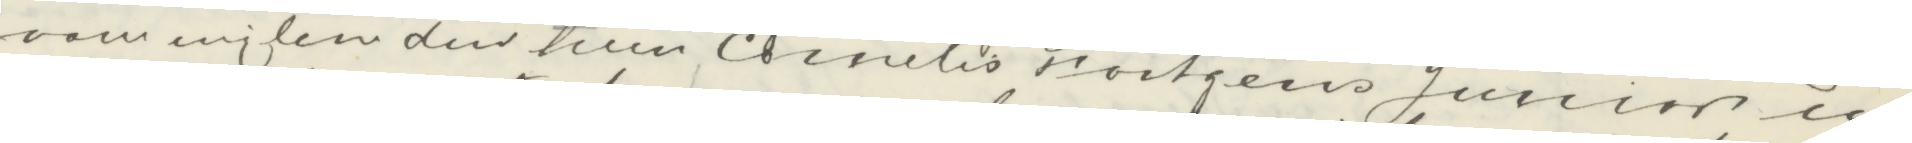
van wijlen den heer Cornelis Fortgens Junior en
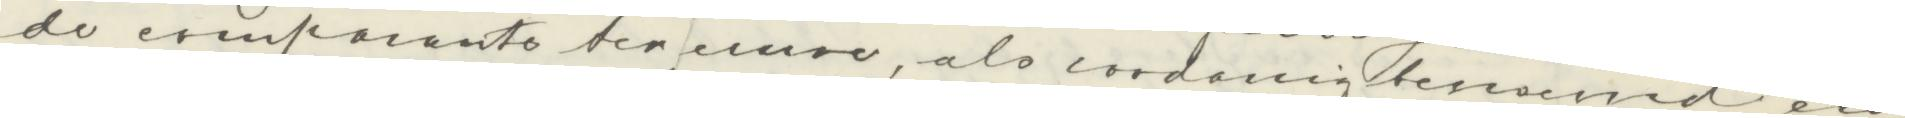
de comparante ter| eenre, als zoodanig toeziend en
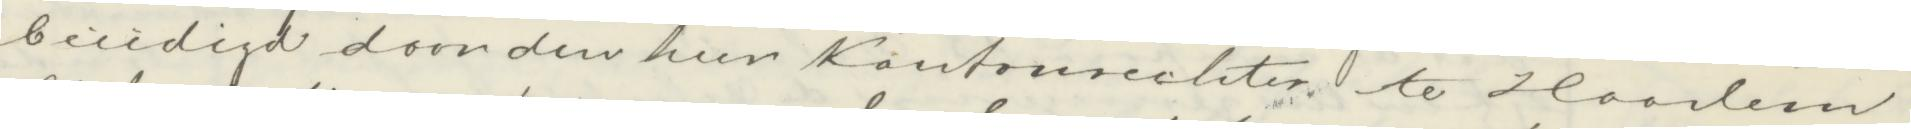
beèèdigd door den heer Kantonrechter te Haarlem
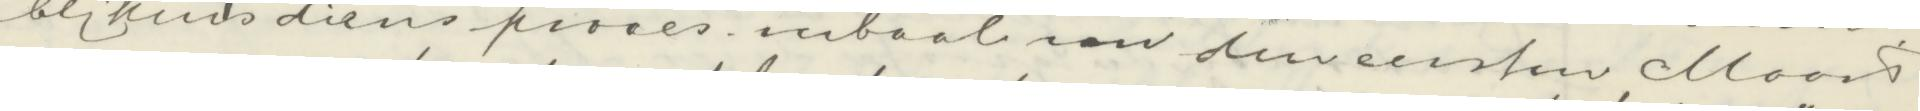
bljkens diens proces verbaal van den eersten Maart
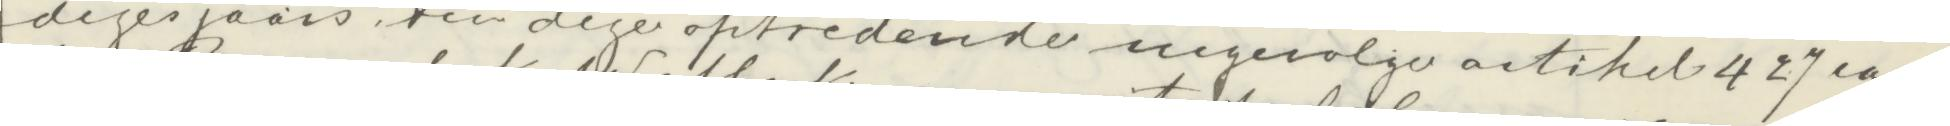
dezes jaars, ten deze optredende ingevolge artikel 427 van
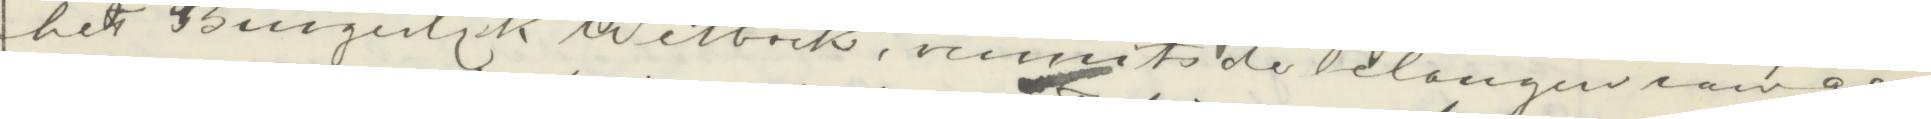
het Burgerlijk Wetboek, vermits de belangen van ge
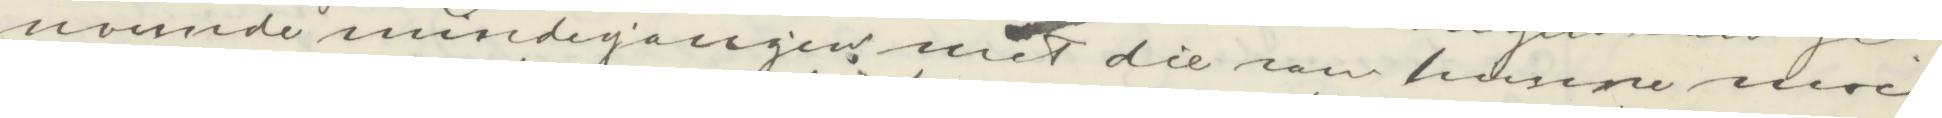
noemde minderjarigen met die van hunne moe
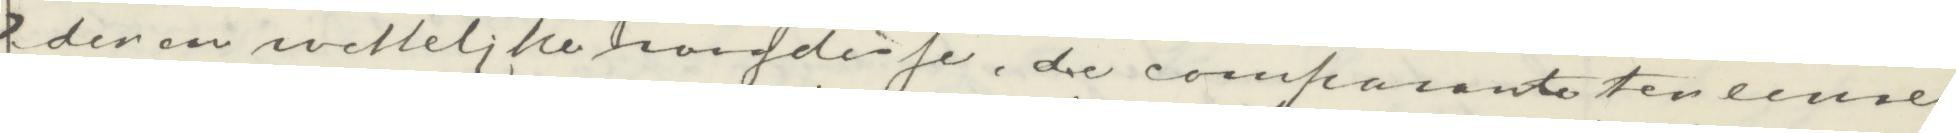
der en wettelijke voogdesse, de comparante ter eenre
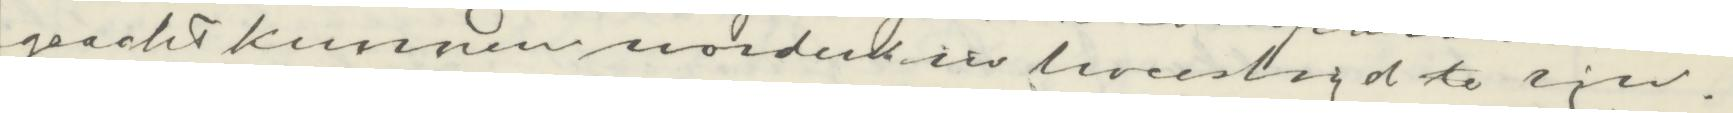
geacht kunnen worden en bevestigd te zjn
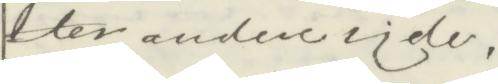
ter andere zijde,
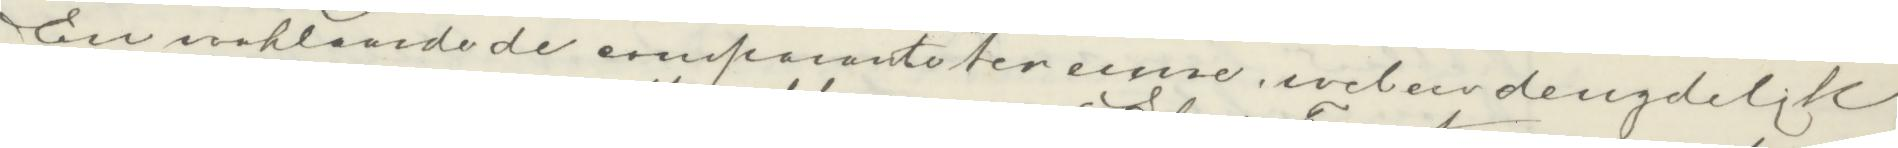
En verklaarde de comparante ter eenre, wel en deugdelijk
